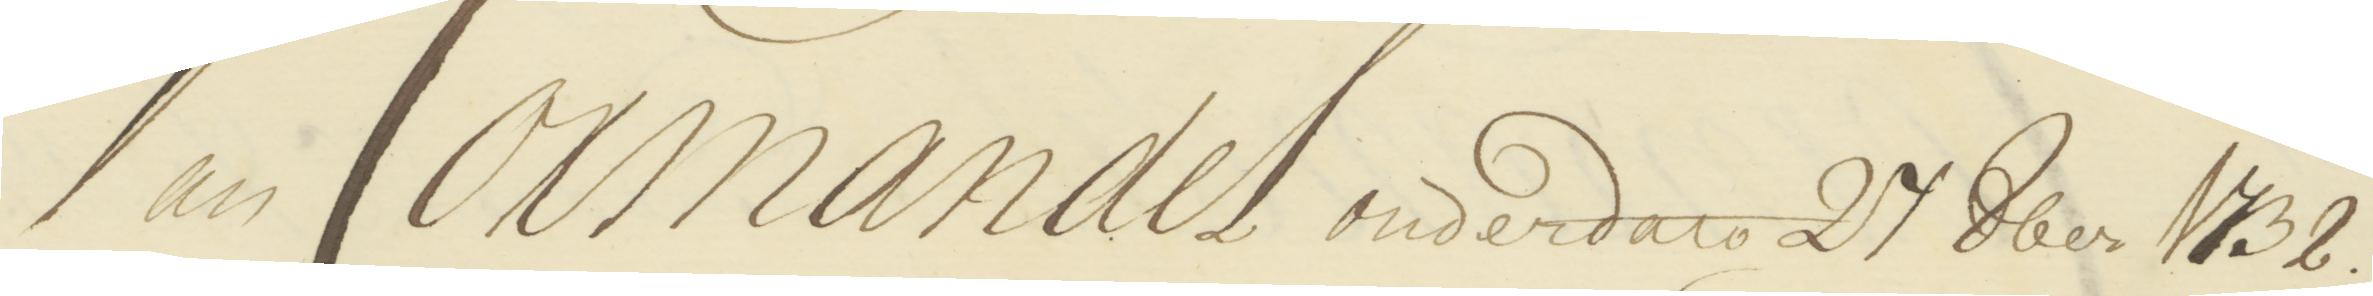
Van Cormandel onder dato 27 8ber 1732.
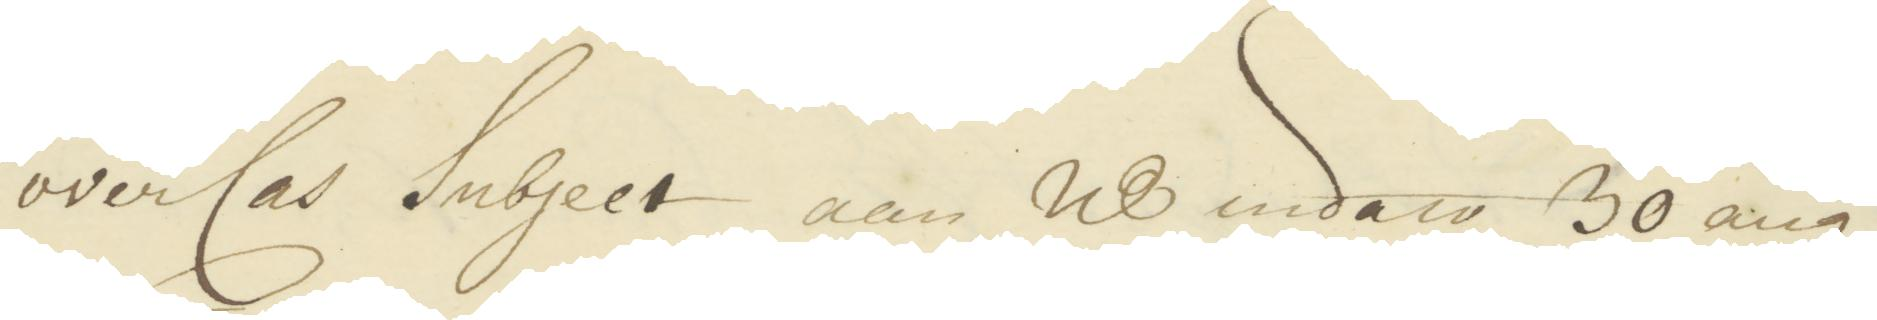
over Cas subject aan UE in dato 30 aug
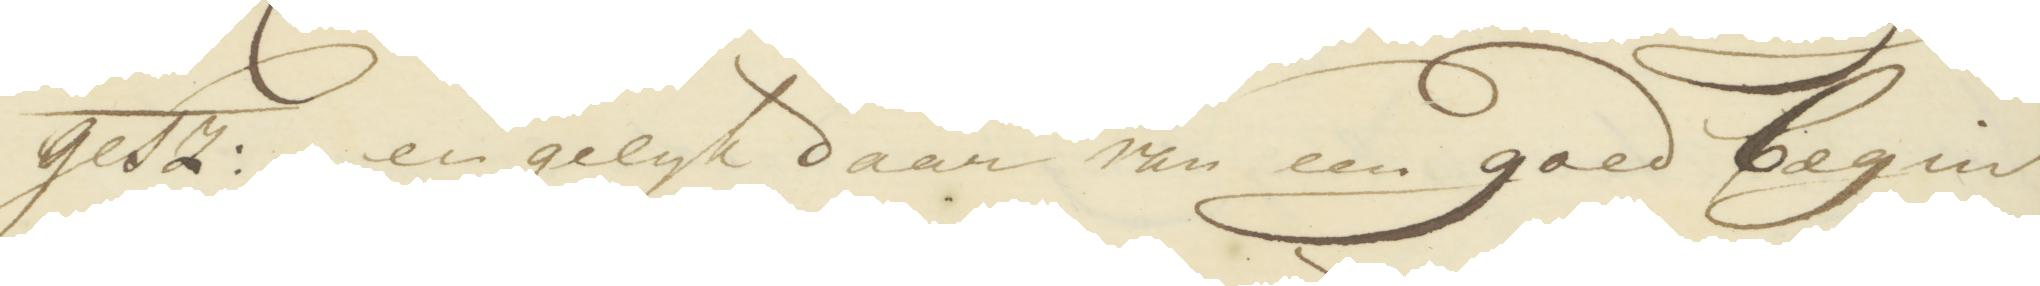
gesz: en gelyk daar van een goed begin
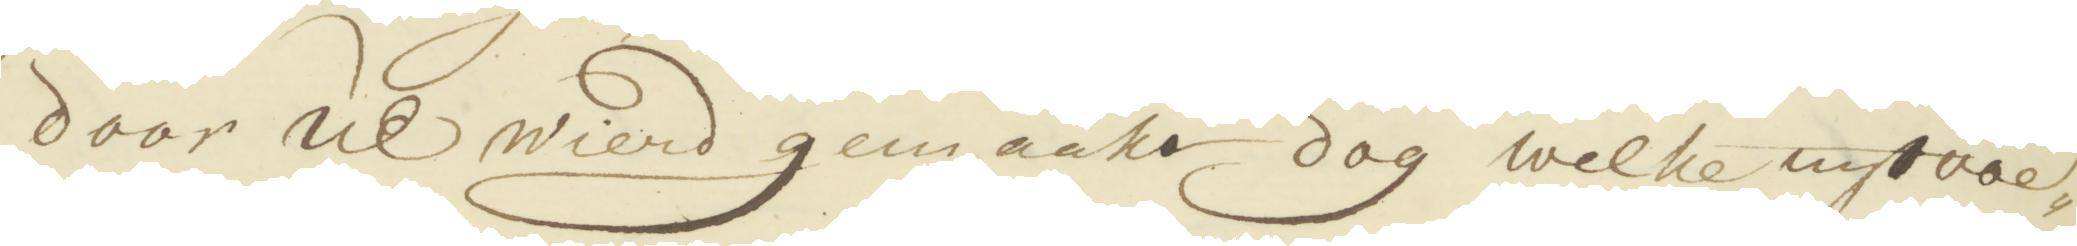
door UE wierd gemaakt dog welke uytvoe„
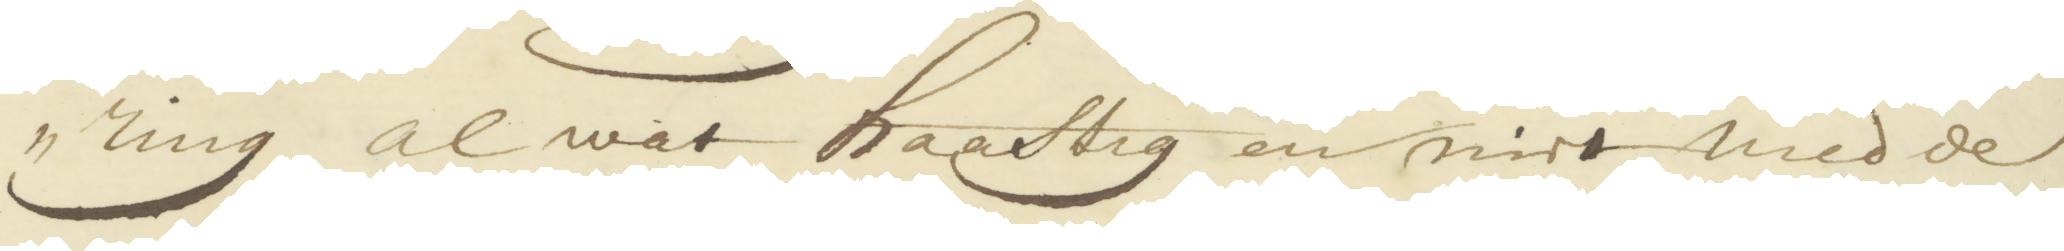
„ring al wat haastig en niet med de
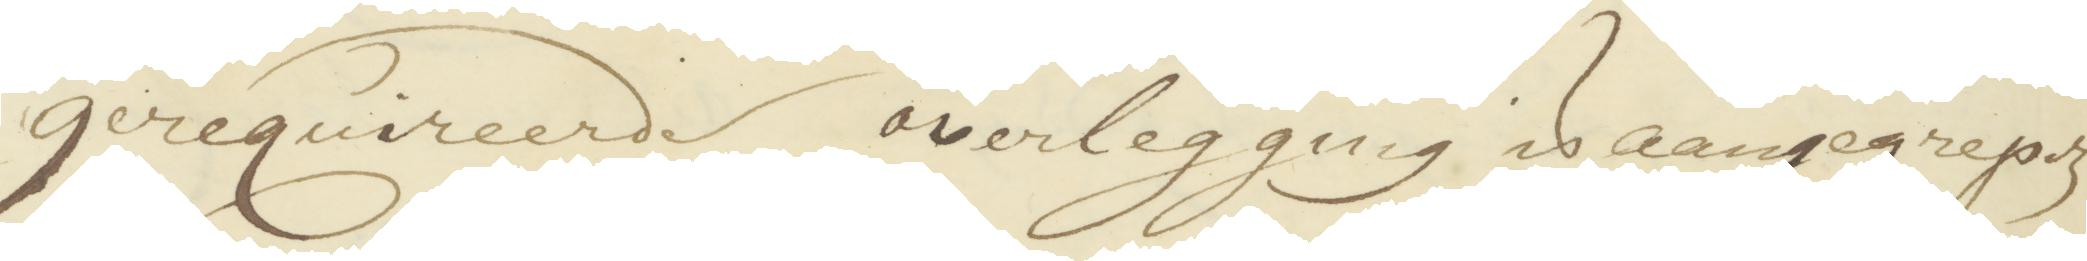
gerequireerde overlegging is aangegrepen
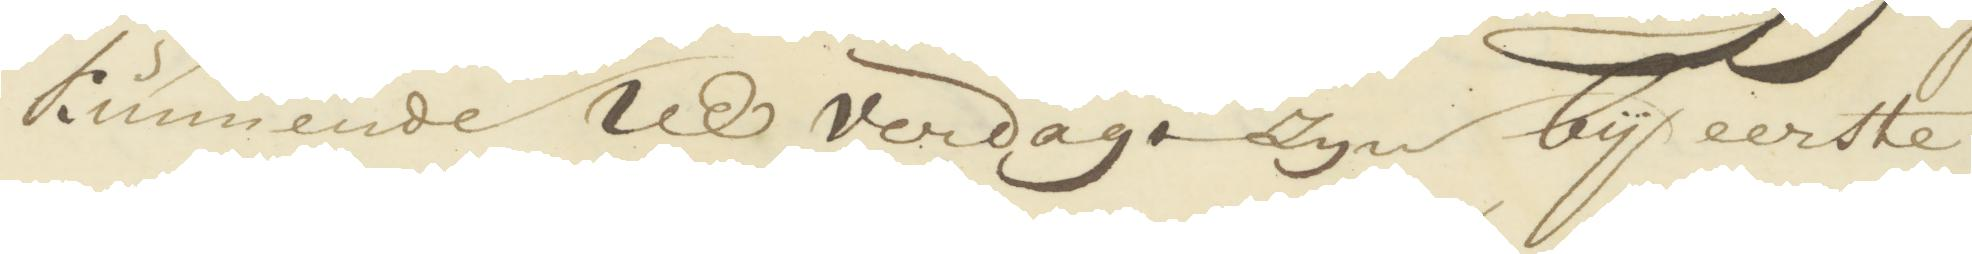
kunnende UE verdagt zyn bij eerste
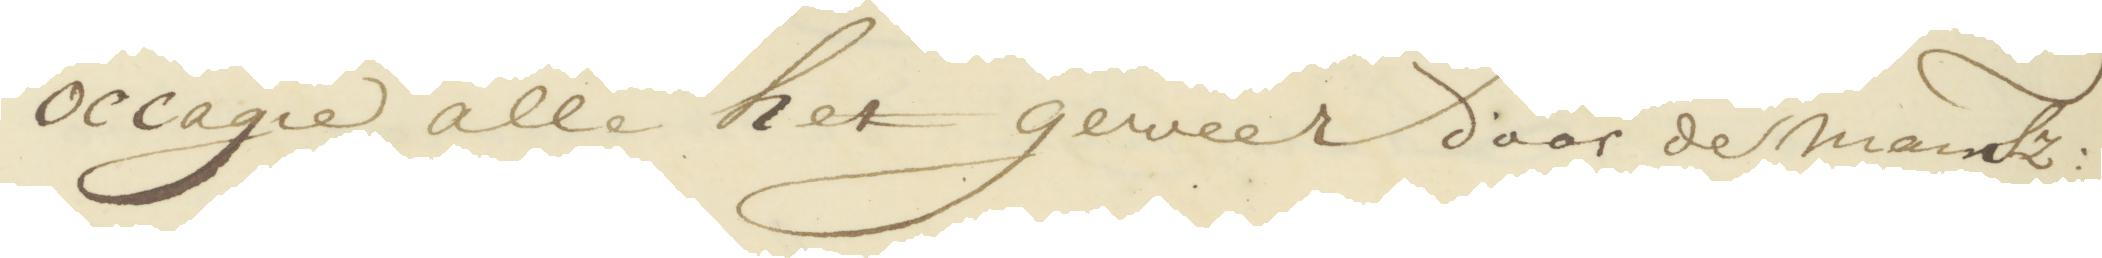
occagie alle het geweer door de mansz:
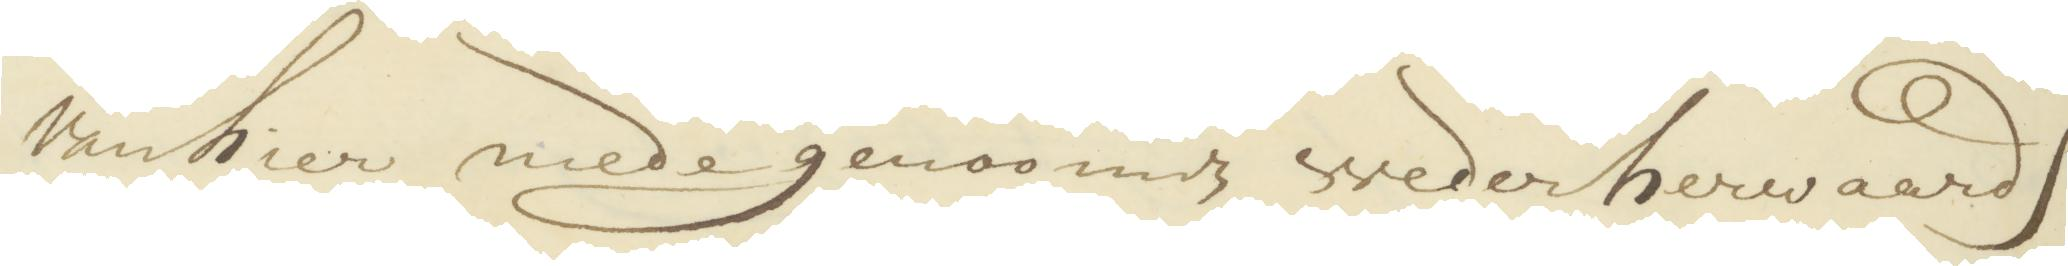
van hier mede genoomen weder herwaards
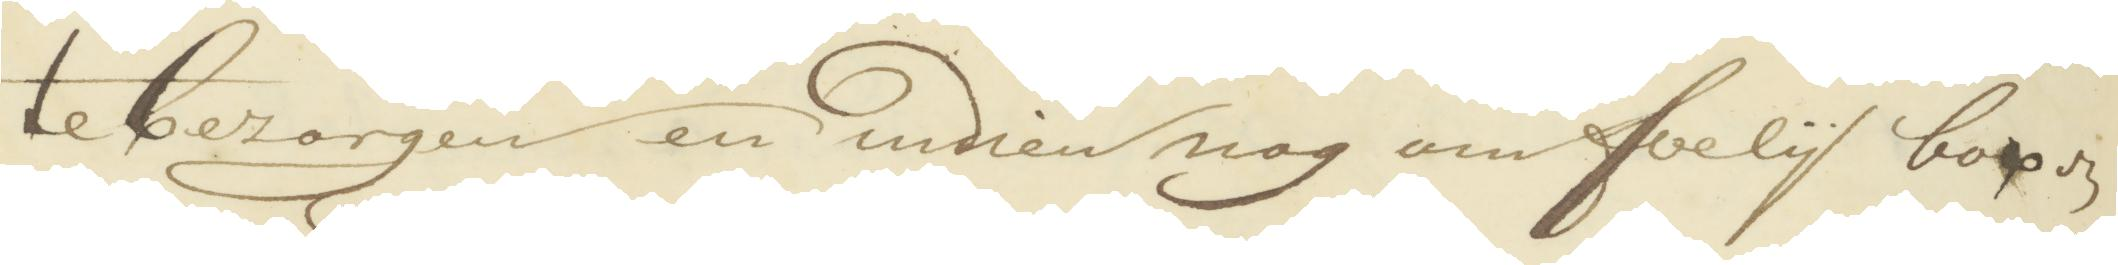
te bezorgen en indien nog om foelij boven
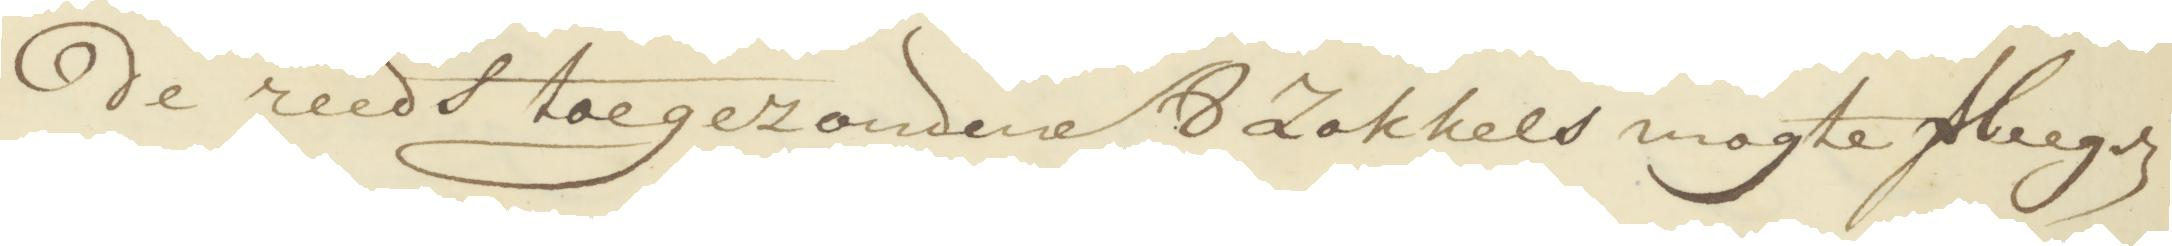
de reeds toegezondene 8 zokkels mogte verleegen
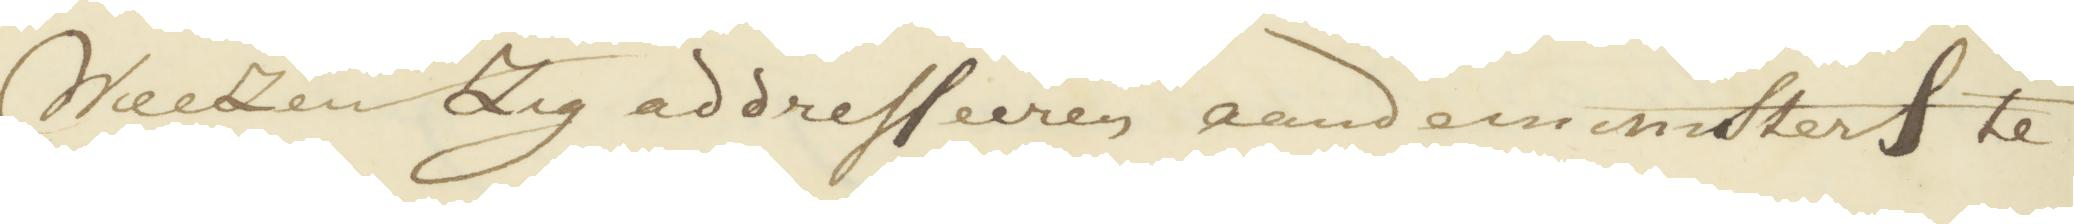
weezen zig addresseeren aan de ministers te
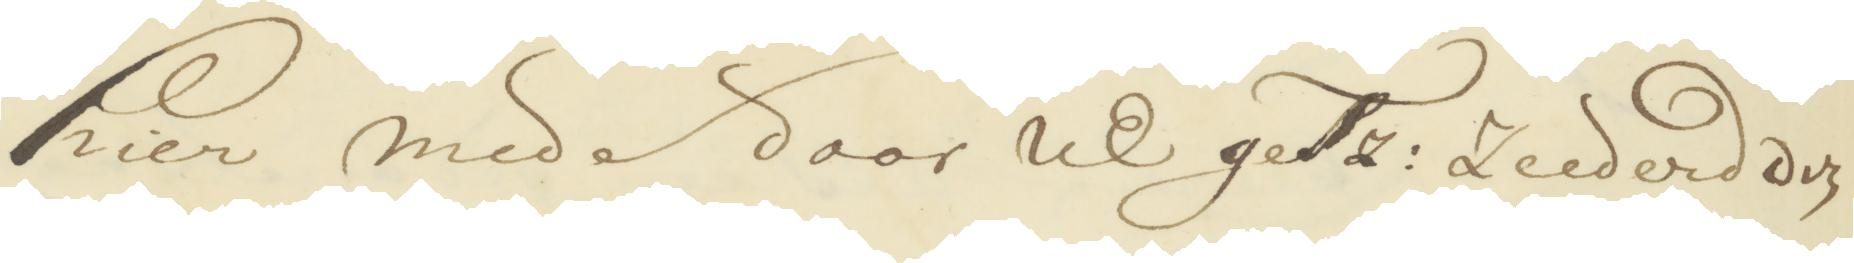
hier mede door UE gesz: zeederd den
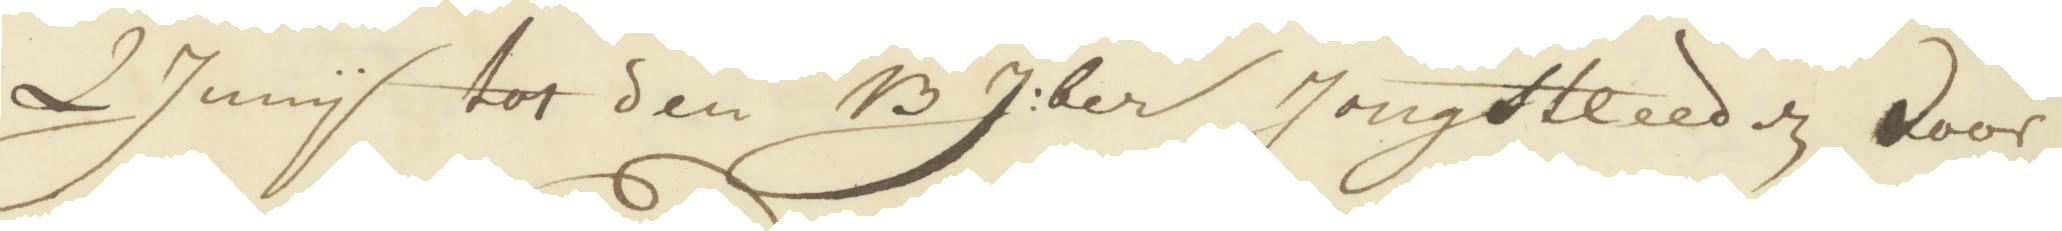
2 Junij tot den 13 7:ber Jongstleeden door
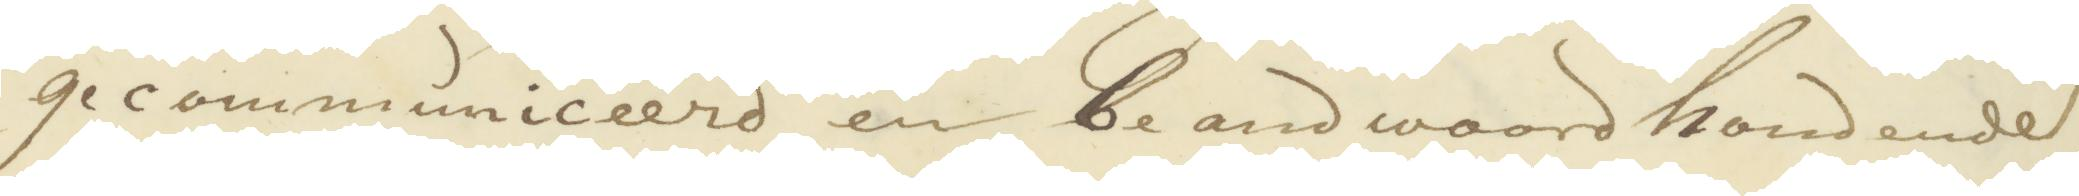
gecommuniceerd en beandwoord houdende
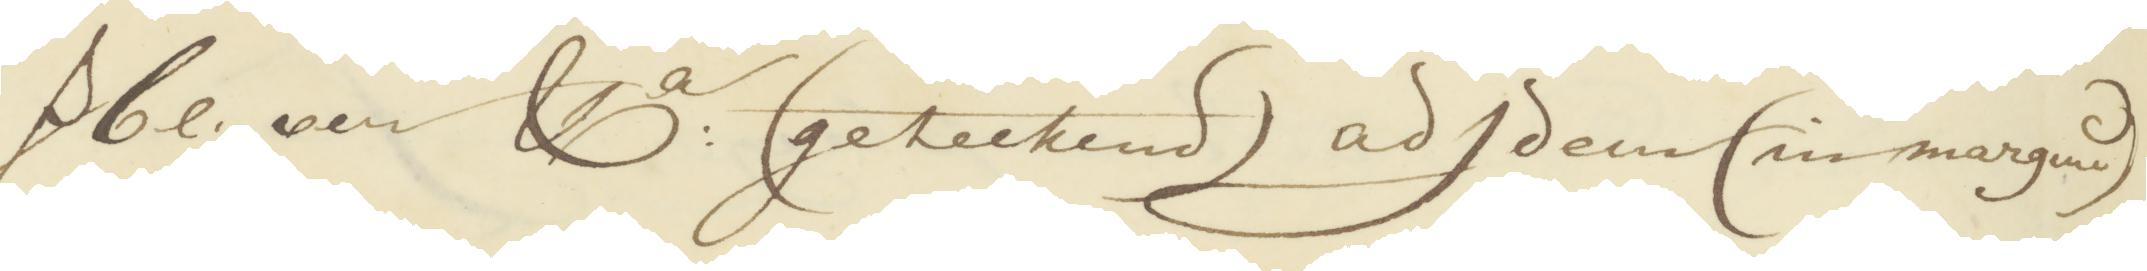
verblyven &:a (geteekend) ad Jdem (in margine)
